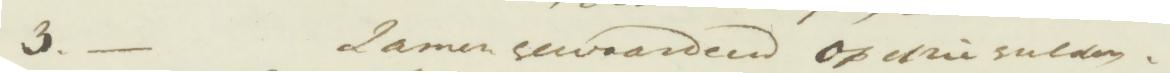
3. — zamen gewaardeerd op drie gulden.
